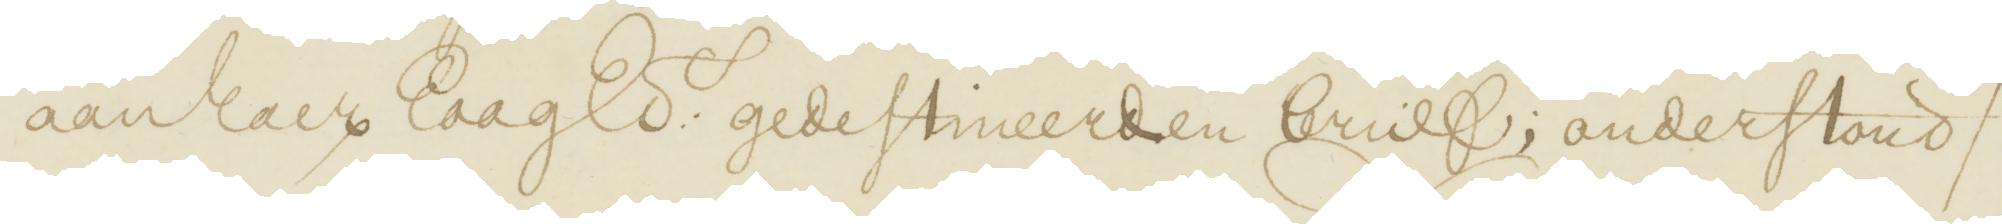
aan haer hoog Ed:s gedestineerden brief; onder stond /
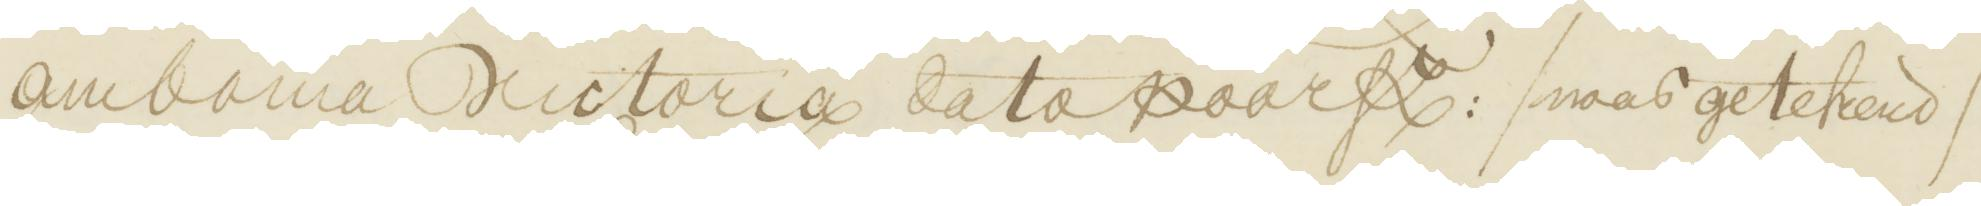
amboina Victoria dato voorsz: /was getekend/
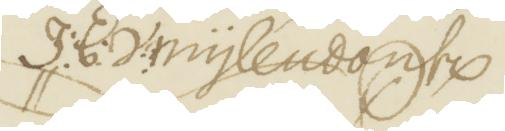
J: E: V: mijlendonk
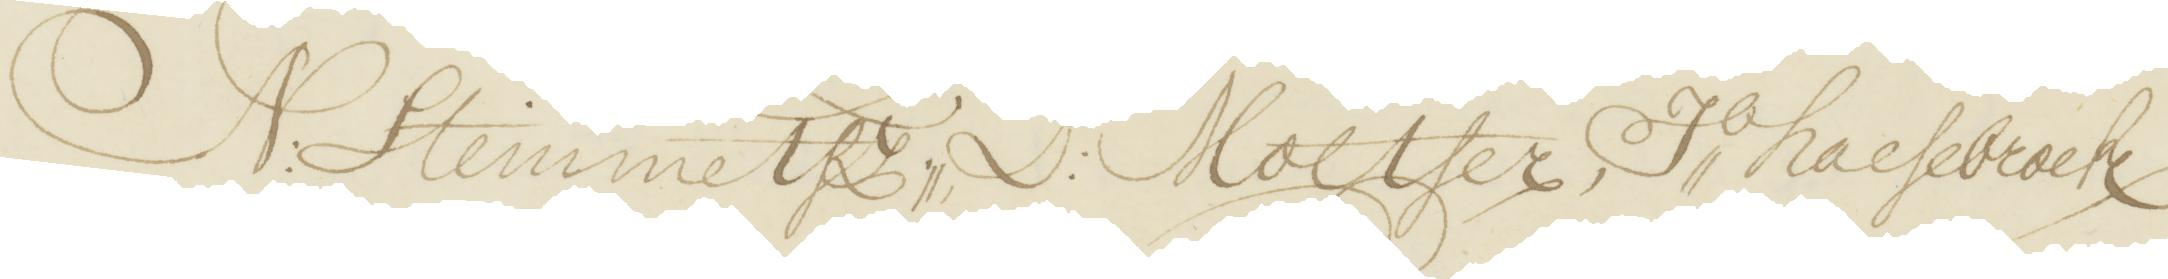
N: Steinmetsz„, D: Moltser, J„b haesebroek
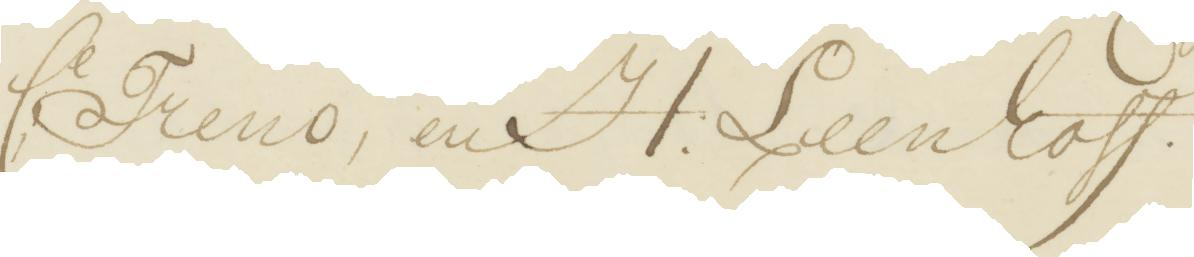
C:l Treno, en H: Leenhoff.
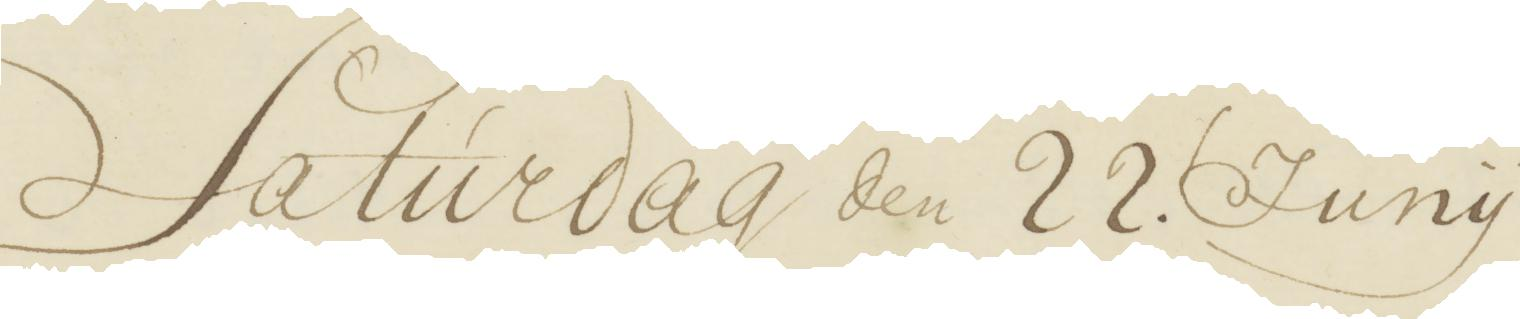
Saturdag den 22. Iunij
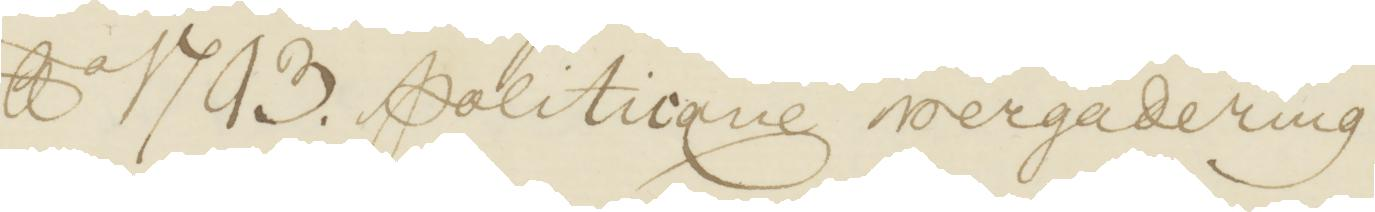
ao 1743. politicque vergadering
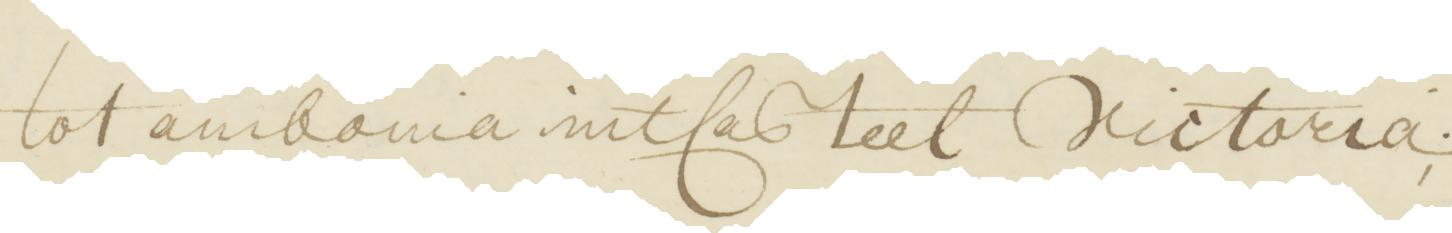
tot amboina in't Casteel Victoria;
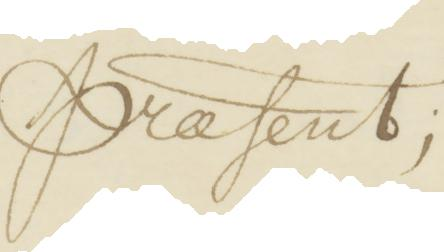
Praesent;
